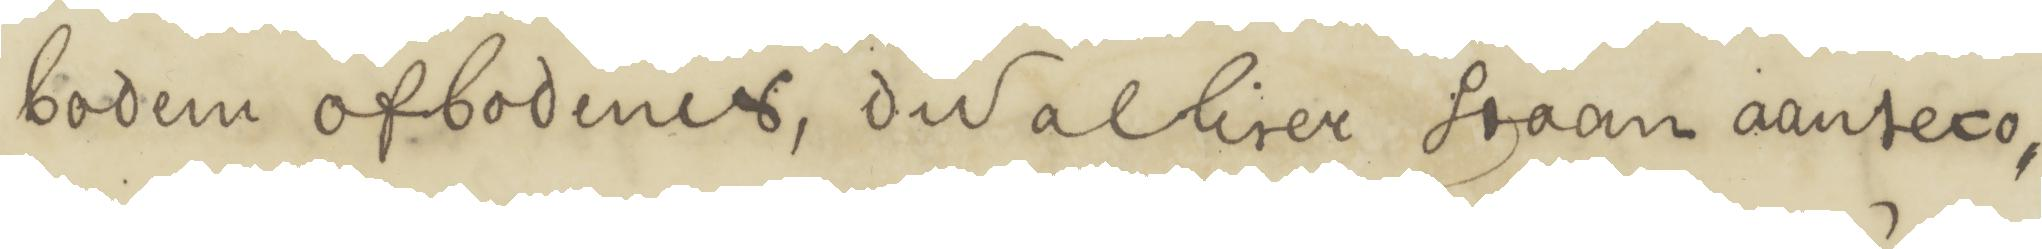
bodem of bodems, die alhier staan aanteco„
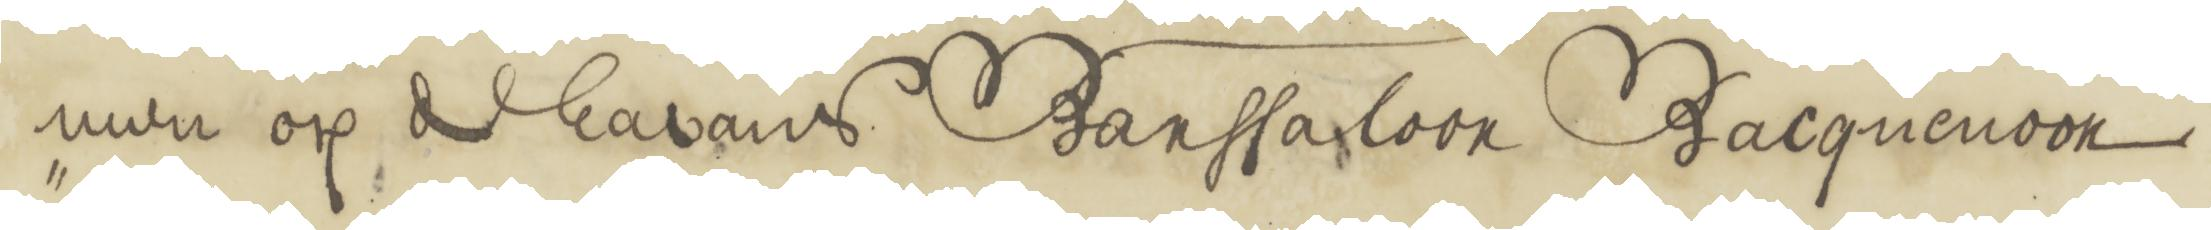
„men op de havans Barssaloor Bacquenoor
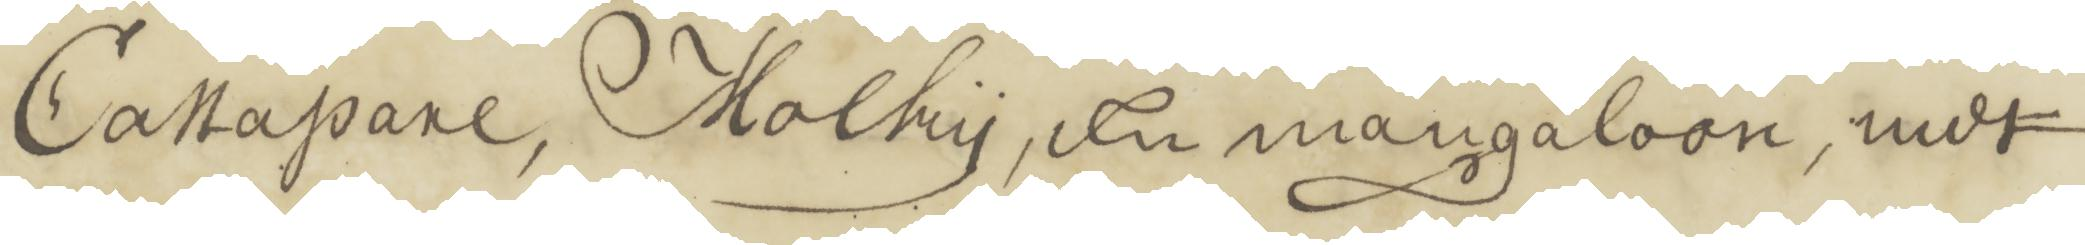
Cattapare, Molkij, En mangaloon, met
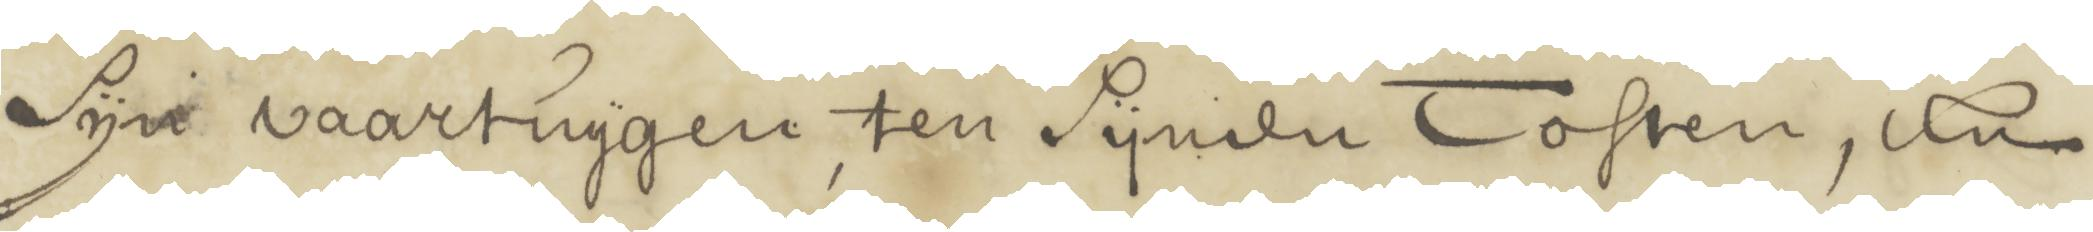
sijn vaartuijgen, ten sijnen Costen, En
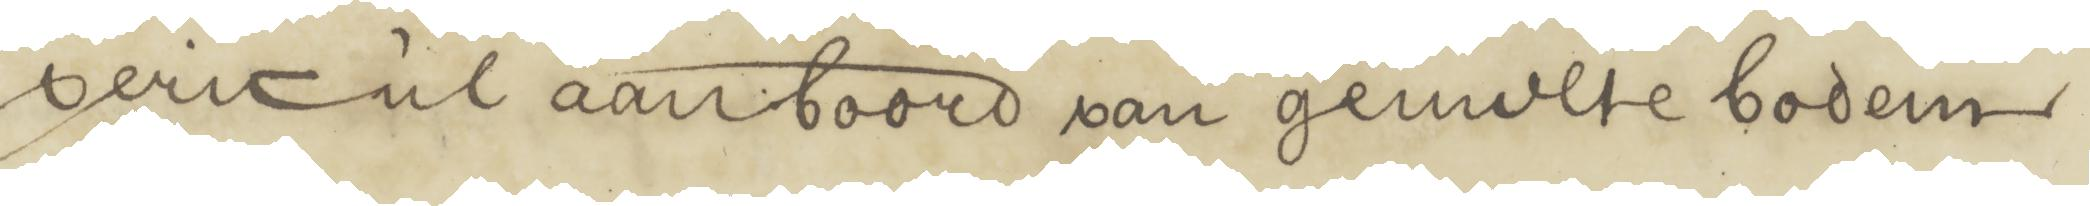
pericul aan boord van gemelte bodem
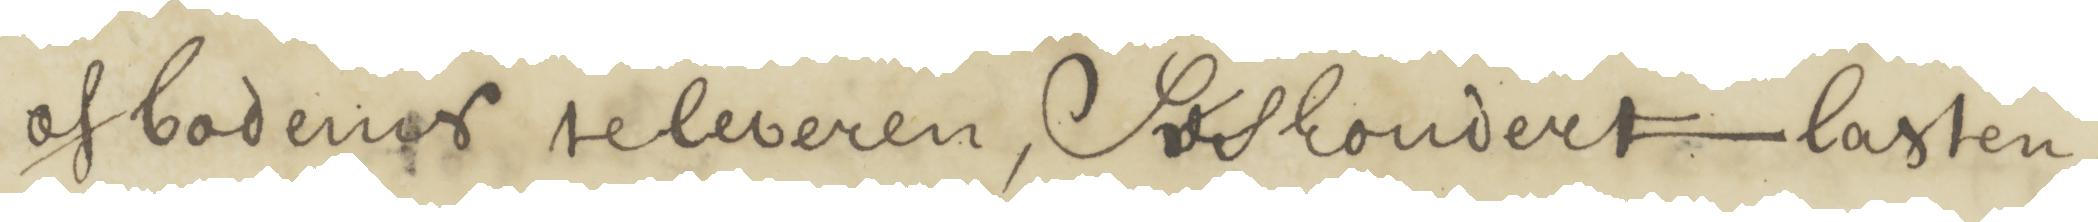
of bodems te leveren, Seshondert lasten
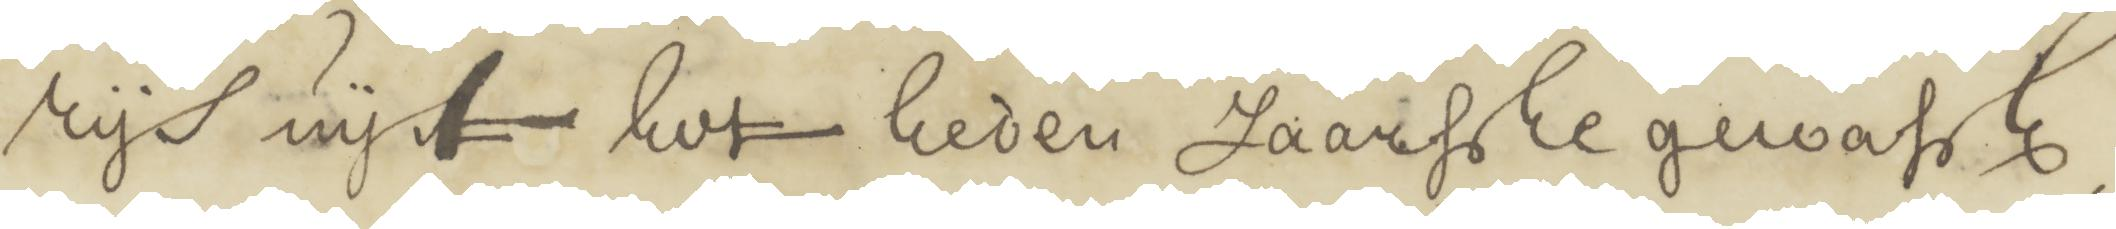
rijs uijt het heden Jaarsche gewasch,
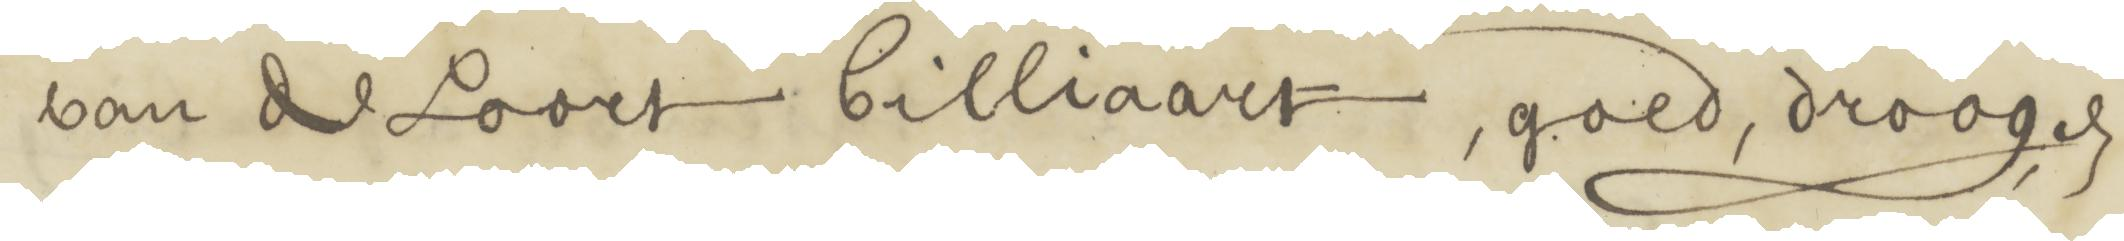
van de soort billiaart, goed, droog, en
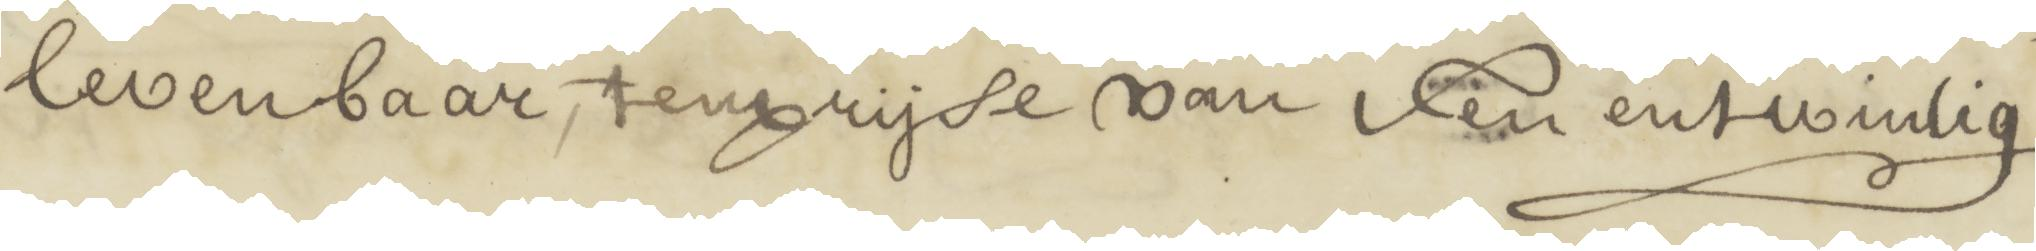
levenbaar, ten prijse van Een en twintig
